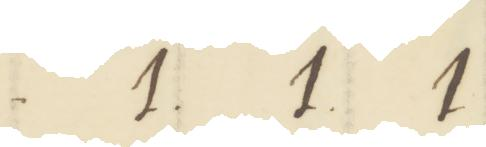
1. 1. 1
